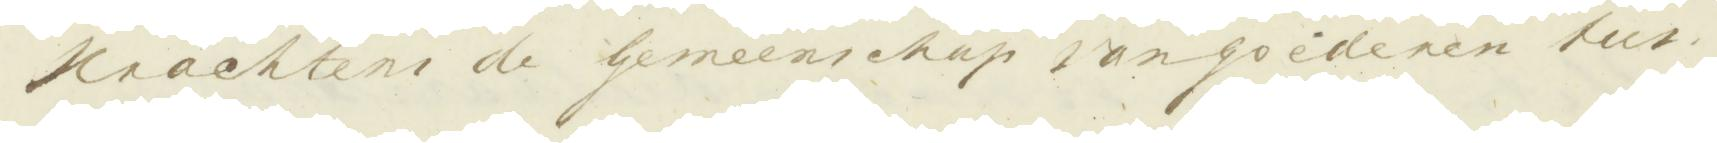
krachtens de gemeenschap van goederen tus,
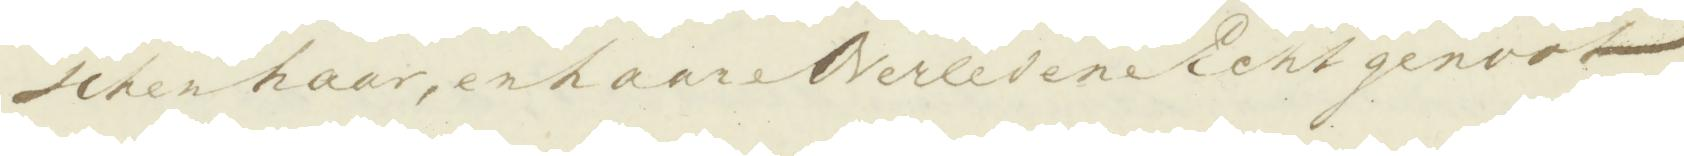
schen haar, en haare Overledene Echt genoot
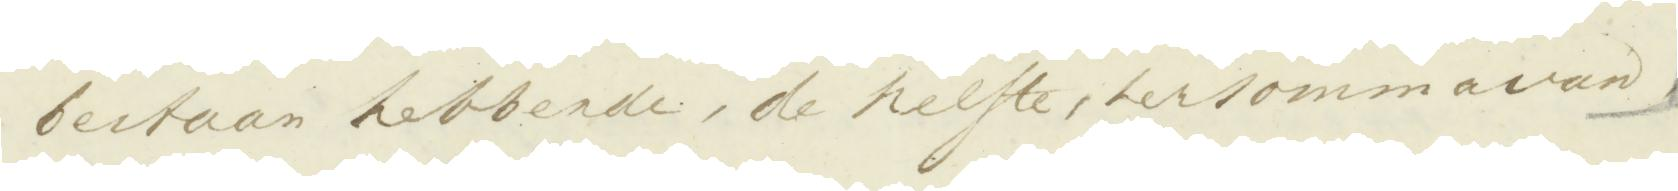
bestaan hebbende, de helfte, ter somma van
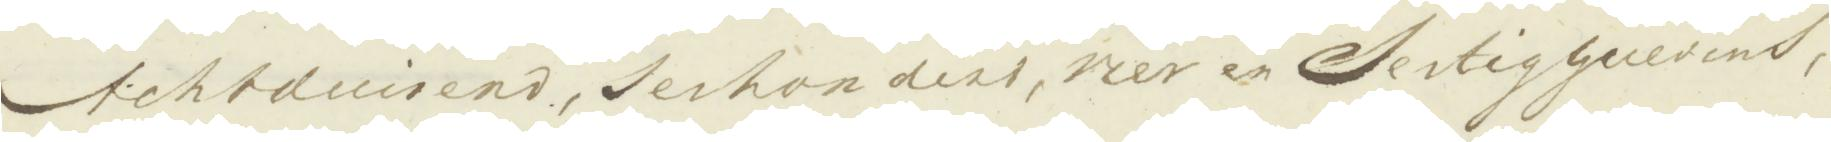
Achtduisend, seshonderd, vier en Sestig guldens,
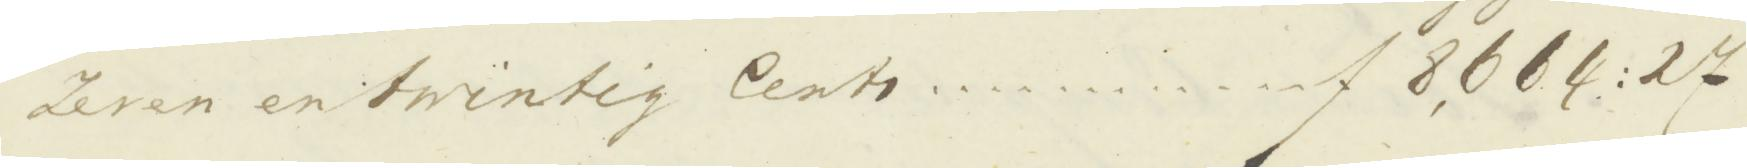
zeven en twintig Cents . . . . . . . . . . . . . . . ƒ 8,664:27
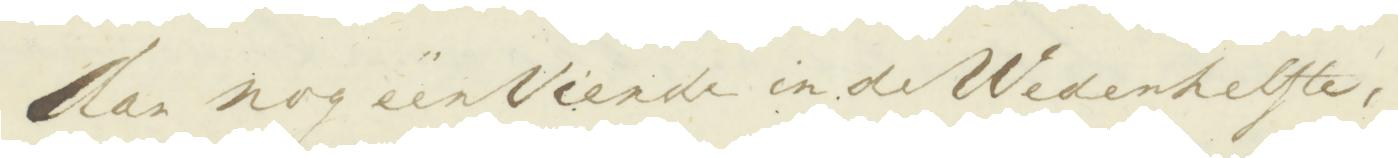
Aan nog één vierde in de Wederhelfte,
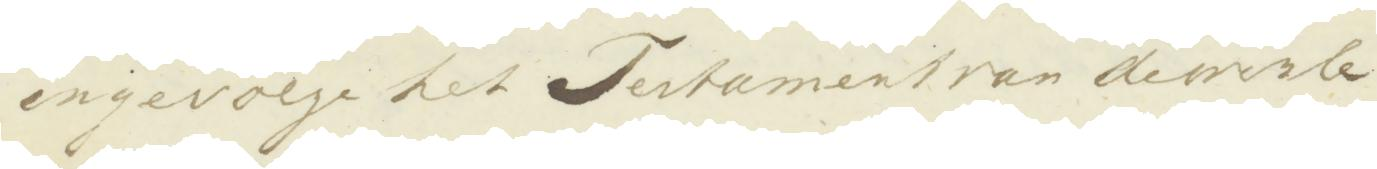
in gevolge het Testament van de overle
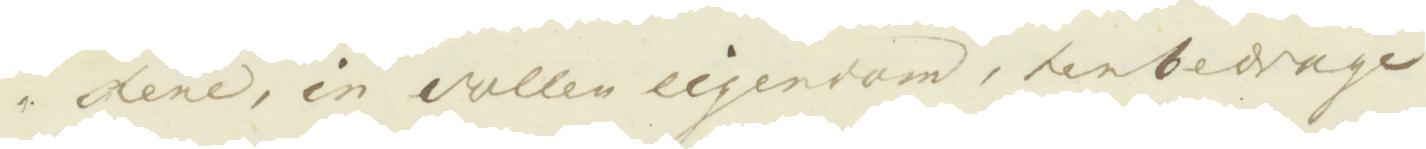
„dene, in vollen eigendom, ten bedrage
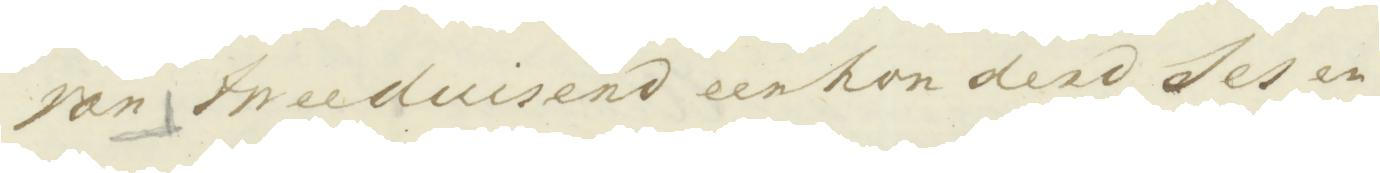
van twee duisend een honderd ses en
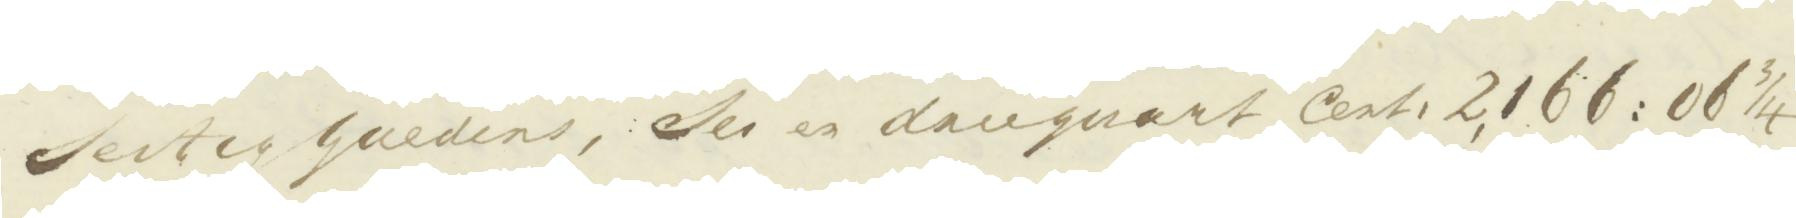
sestig guldens, ses en driequart cent 2,166: 06 ¾
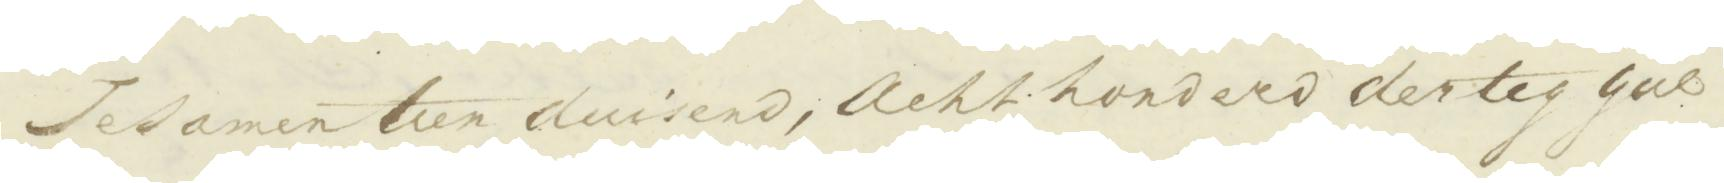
Tesamen tien duisend, acht honderd dertig gul
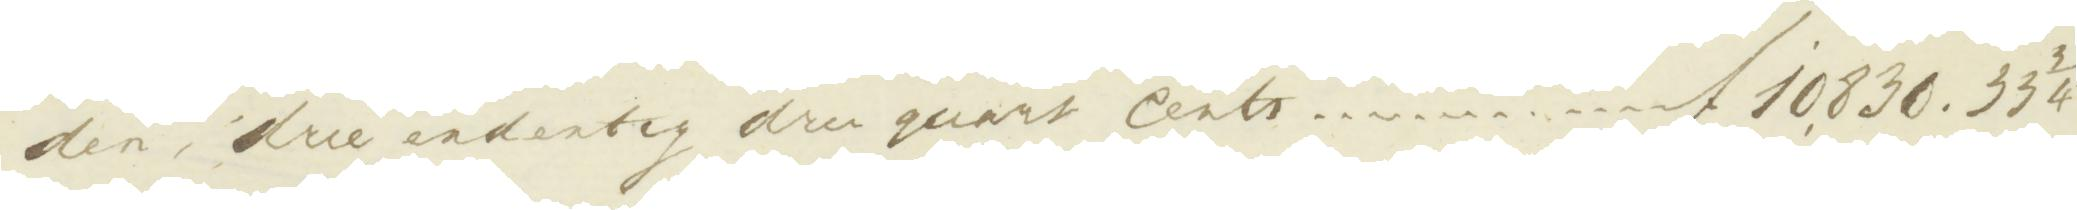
den, drie en dertig drie quart Cents . . . .. . . . .ƒ10,830. 33 ¾
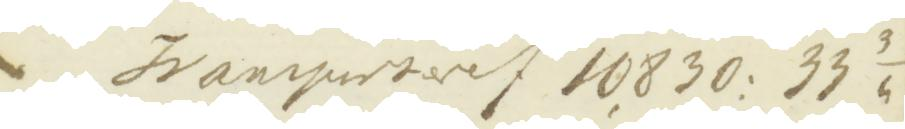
Transportere ƒ10,830: 33 ¾
